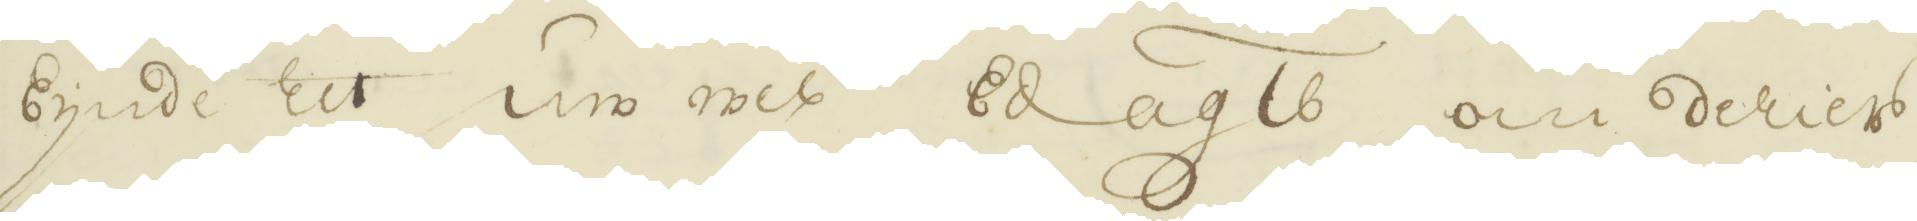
Eynde het uw wel Ed agtb om dehier
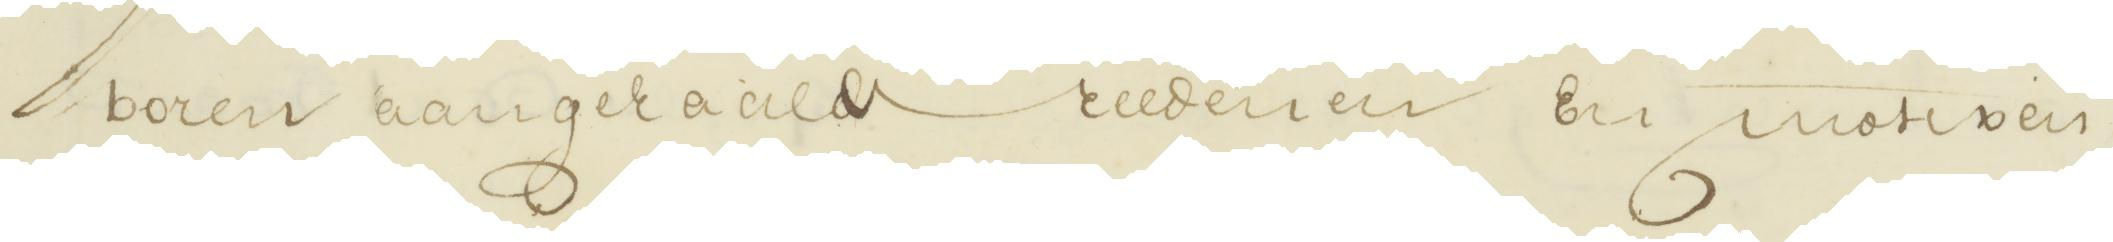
voren aangehaalde reedenen En motiven
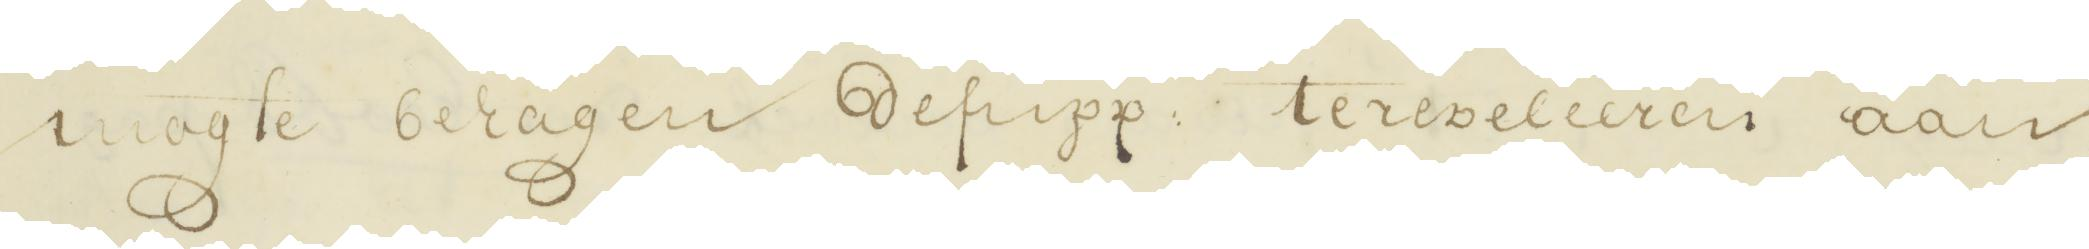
mogte behagen desupp:s te reveleeren aan
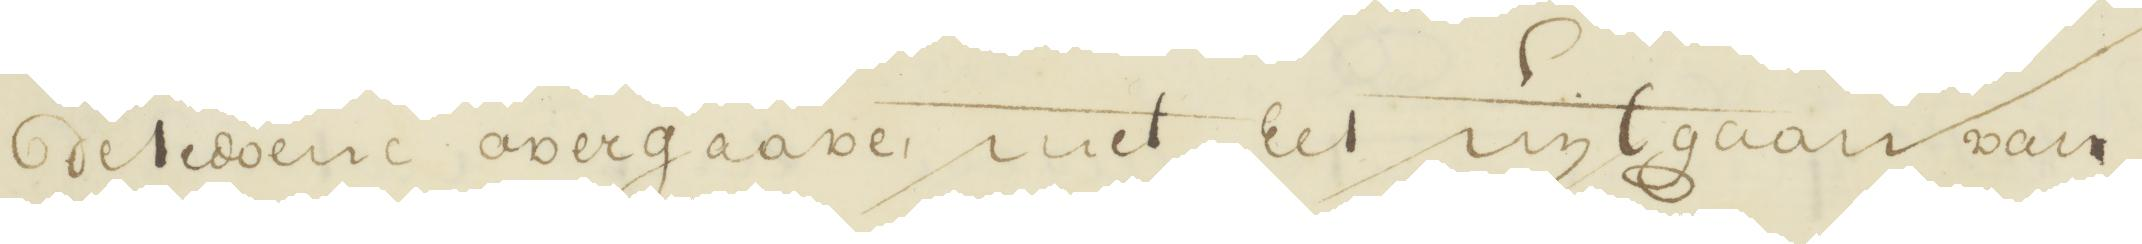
de tedoene overgaave met het uytgaan van
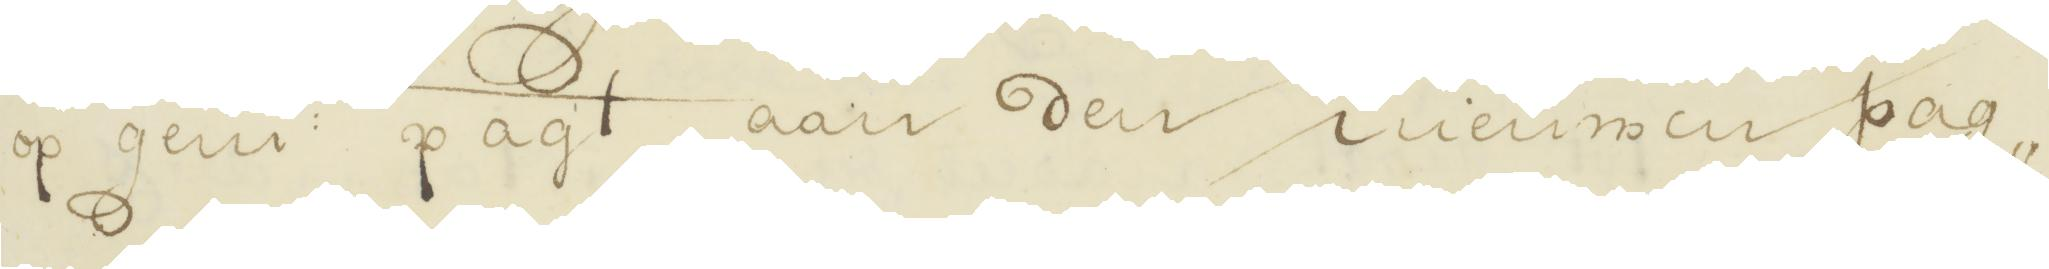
op gem: pagt aan den nieuwen pag„
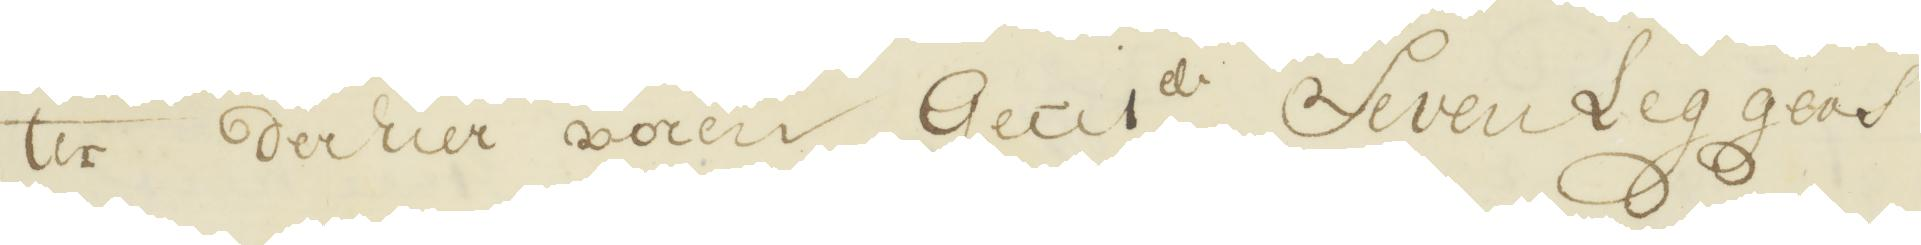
ter der hier voren gecitde Seven Leggers
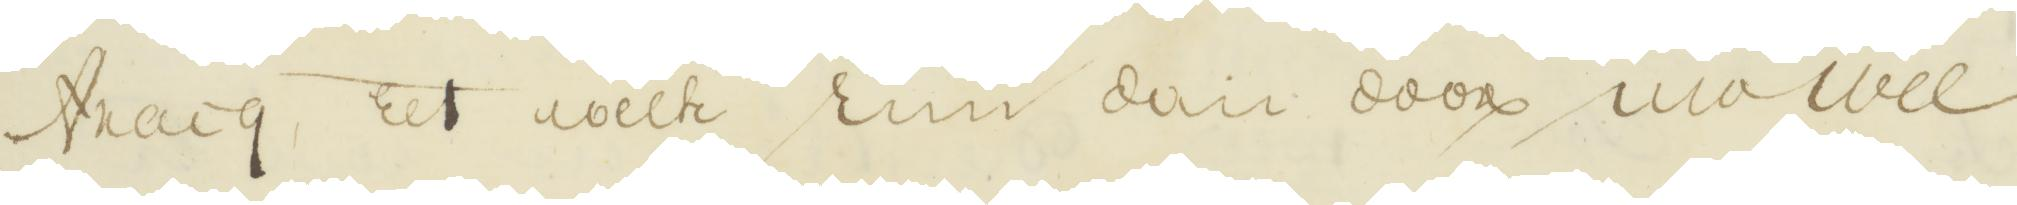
Aracq het welk hun dan door uw wel
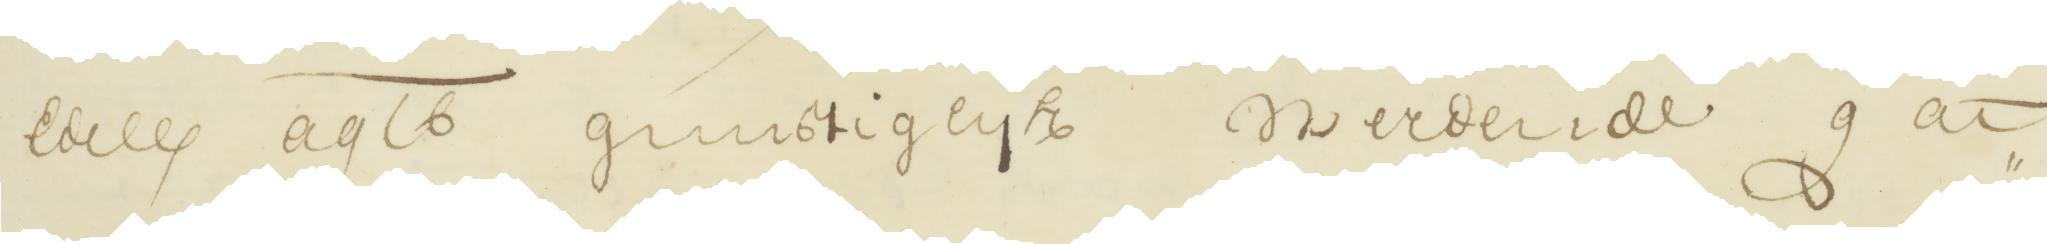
Edele agtb gunstiglyk werdende g’ac„
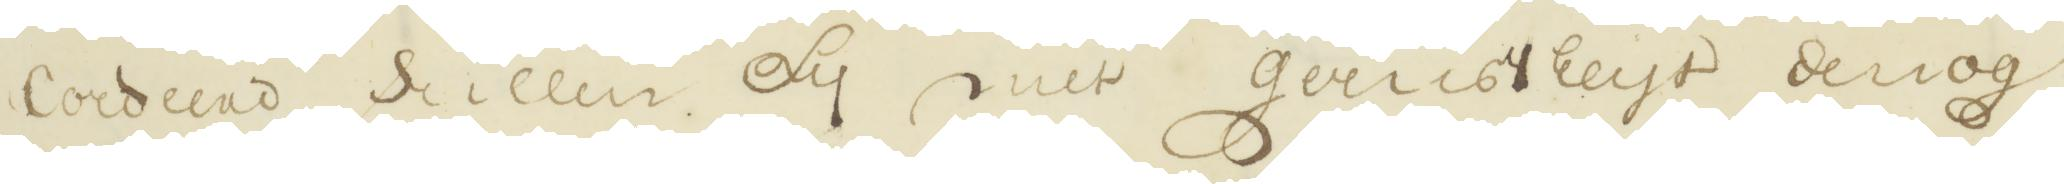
cordeerd sullen sy met g ernstheyt de nog
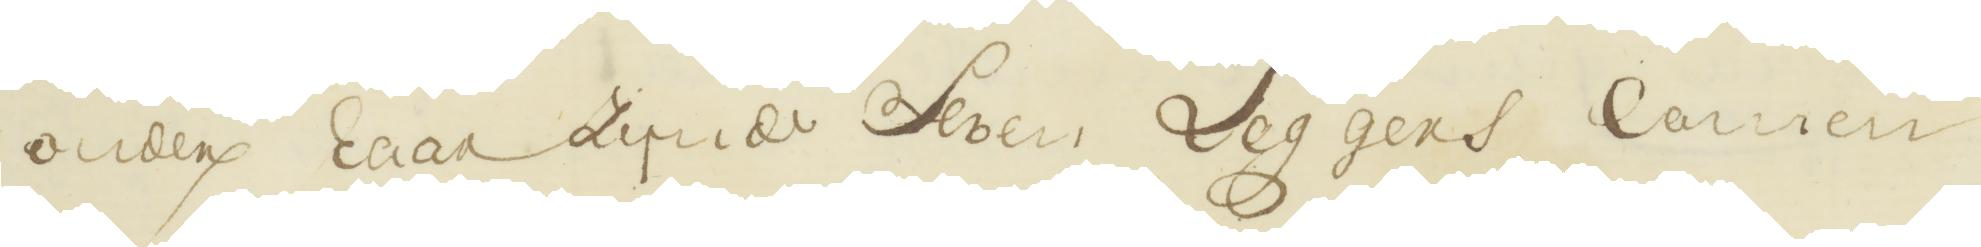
onder haar zynde Seven Leggers camen
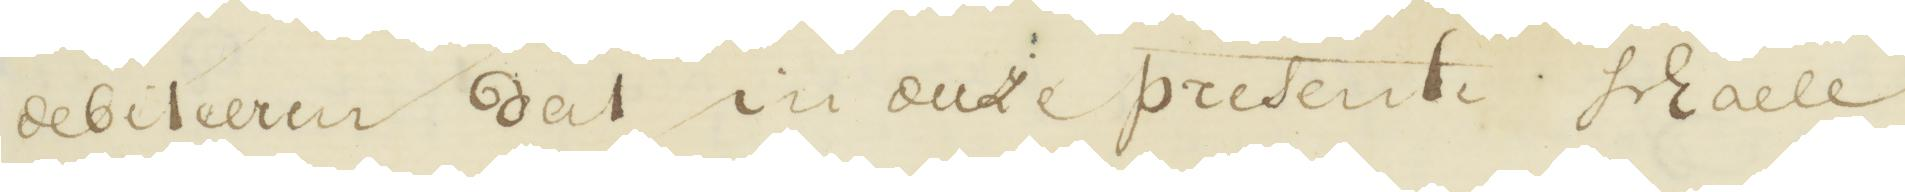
debiteeren dat in onze presenti schaele
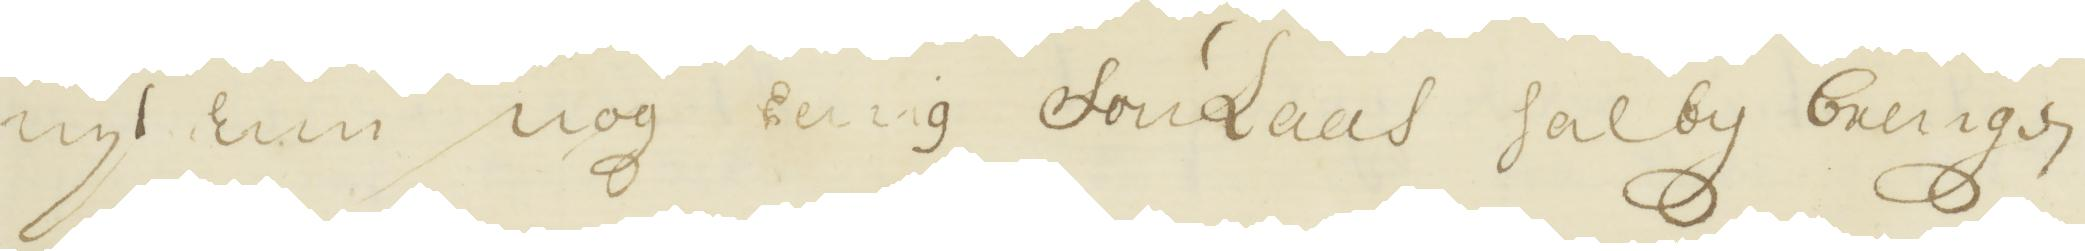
uyt hun nog Eenig soulaas sal by brengen
